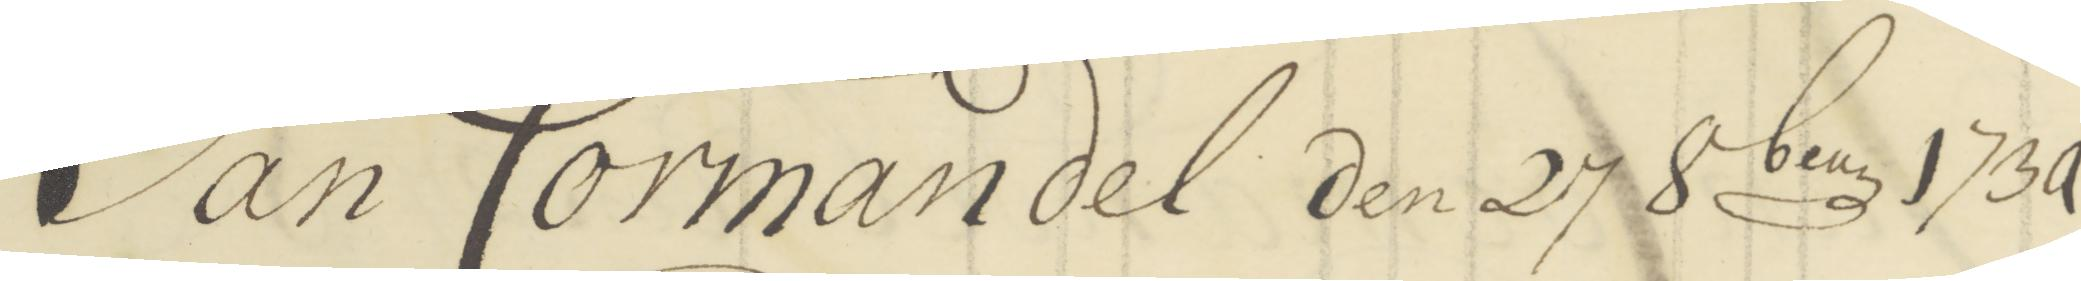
Van Cormandel den 27 8ber 1734
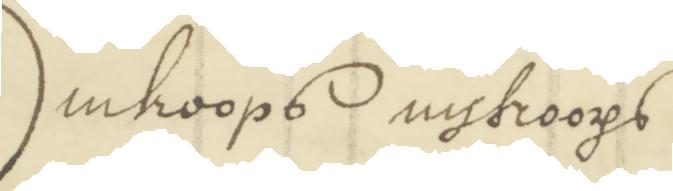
inkoops uijkoops
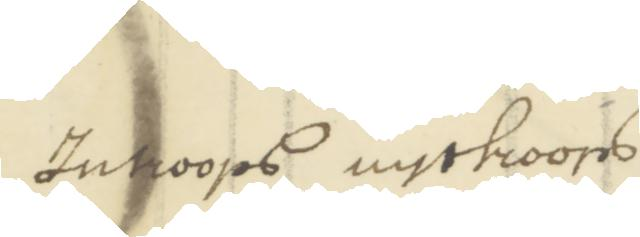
Inkoops uijtkoops
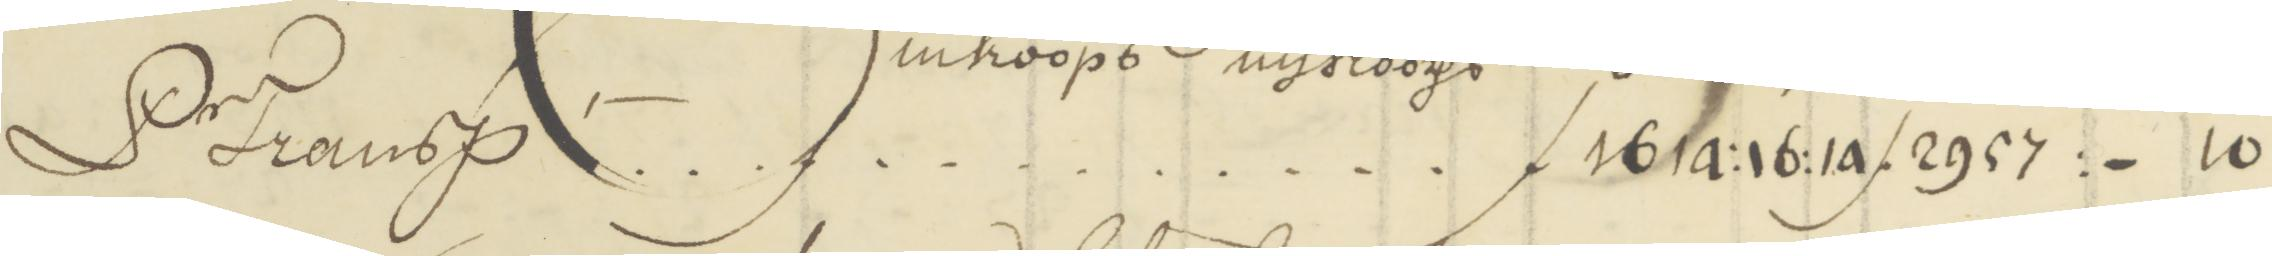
Pr Transp t.. . . . . . . . . . . . ƒ 1614:16:14 ƒ 2957: — 10
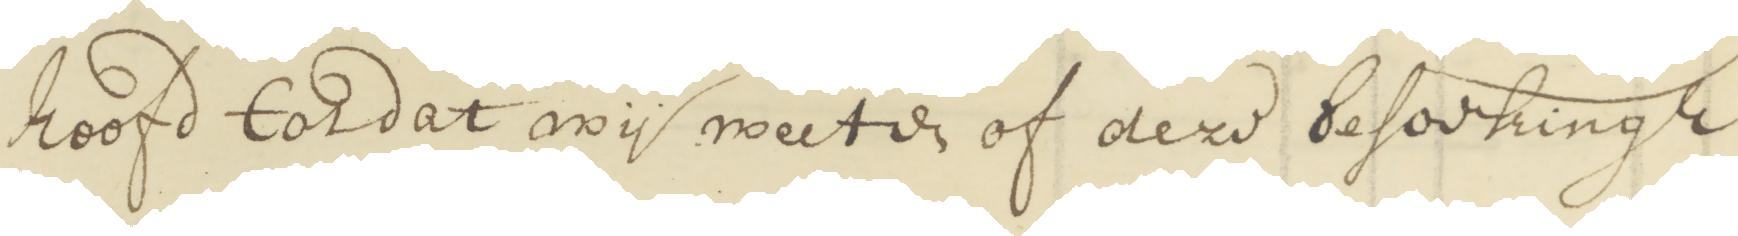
hoofd tot dat wij weeten of deze besoekingh
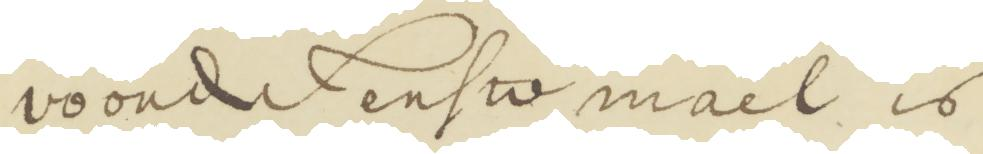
voor de Eerste mael is
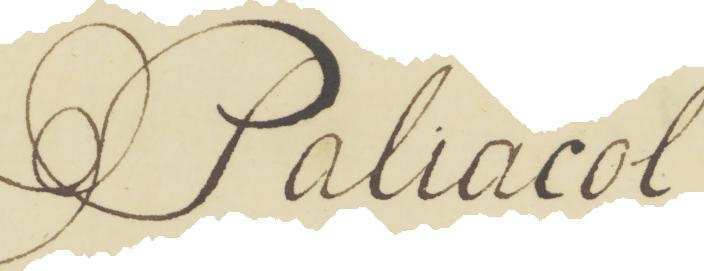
Paliacol
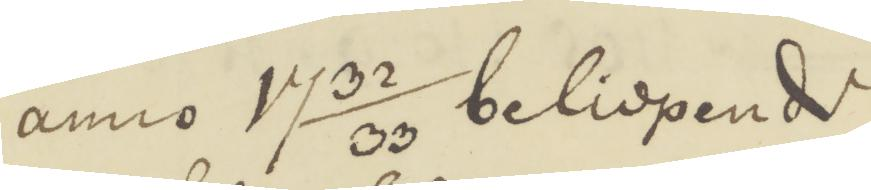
anno 1732/33 beliepende
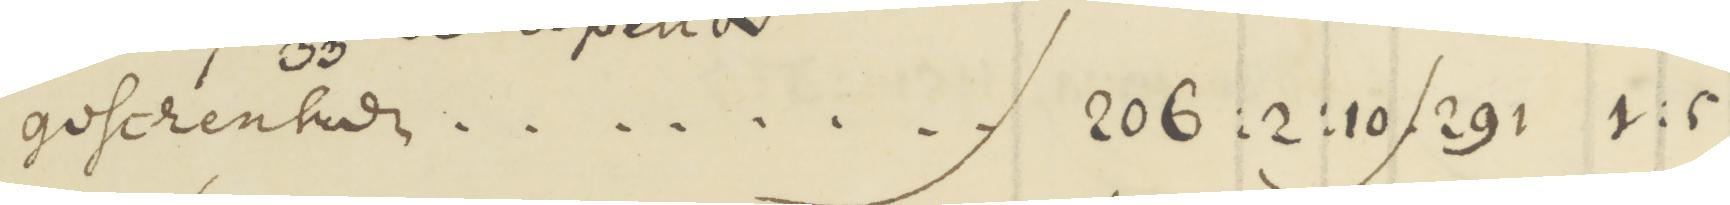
geschenken . . . . . . . ƒ 206: 2: 10 ƒ 291 1: 5
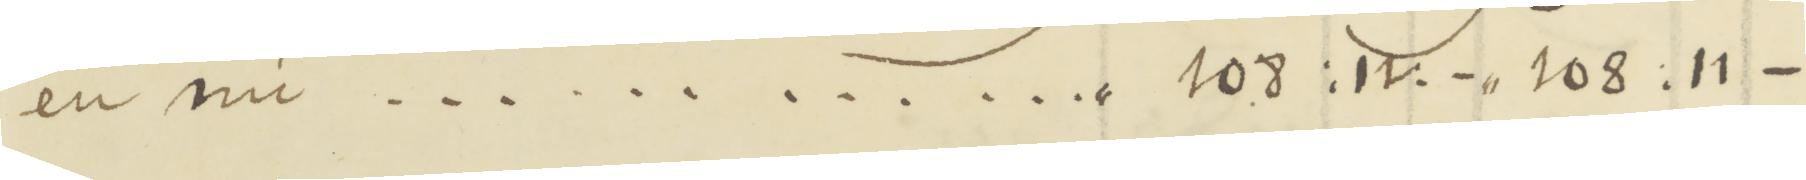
en nu . . . . . . . . . . . .„ 108: 11: — „ 108: 11 —
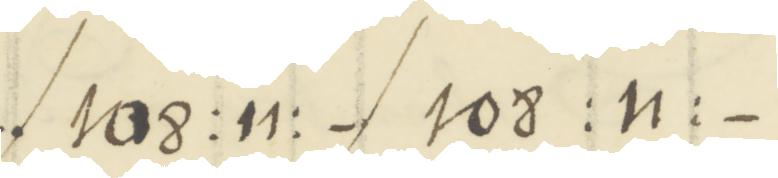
ƒ 108: 11: — ƒ 108: 11: —
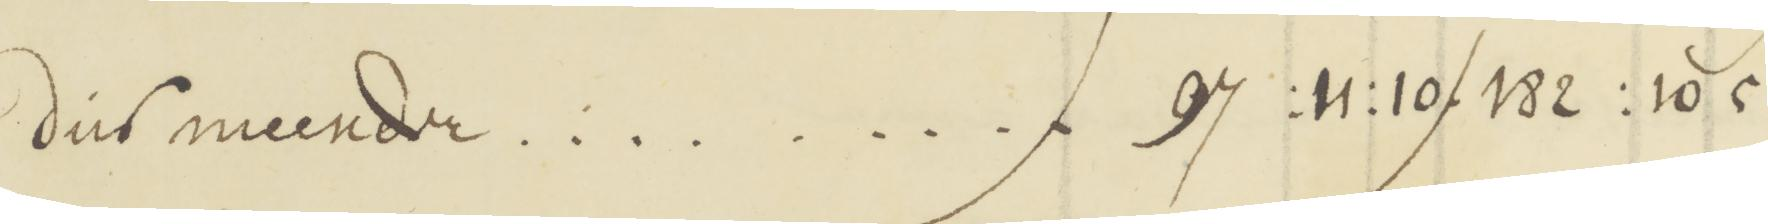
dus meerder . . . . . . . . ƒ 97: 11: 10 ƒ 182: 10 5
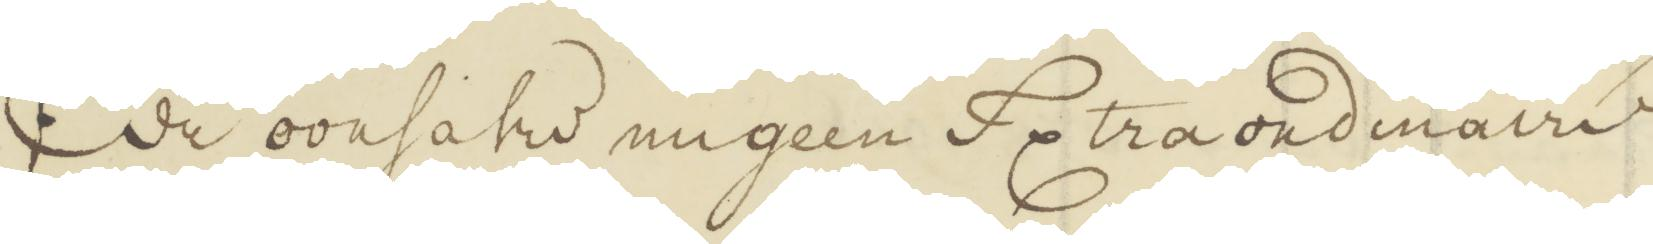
Ter oorsake nu geen Extra ordinaire
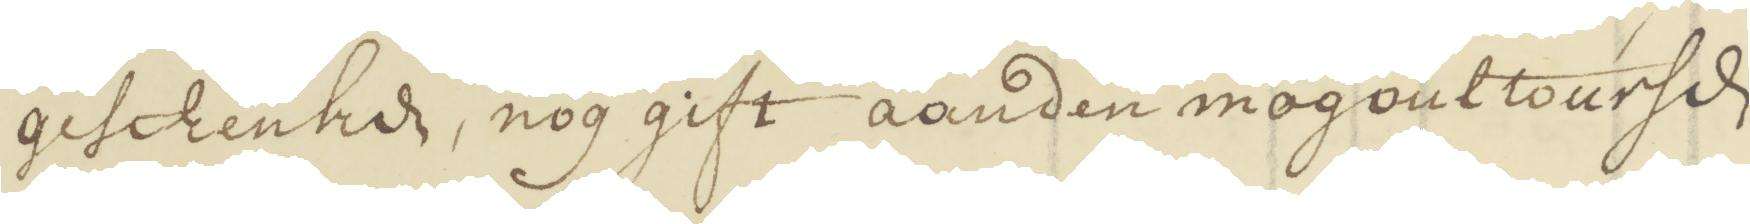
geschenken, nog gift aan den mogoultoursen
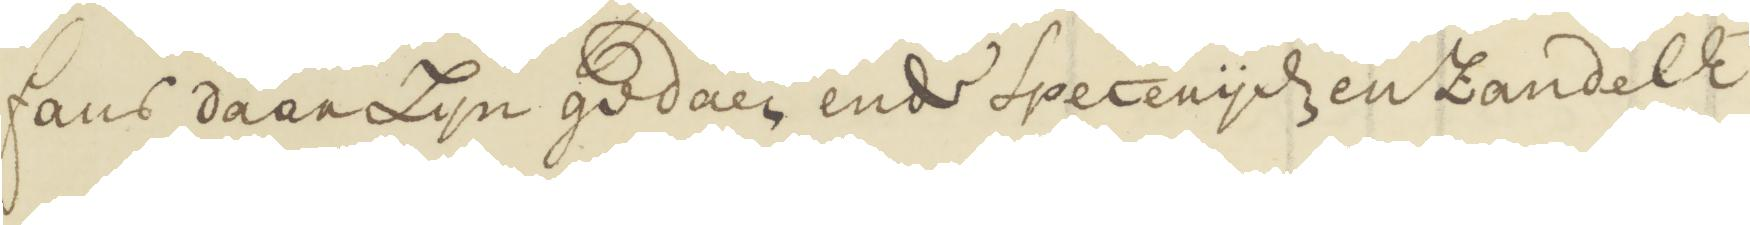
fans daar zyn gedaen ende specerijen en zandelht
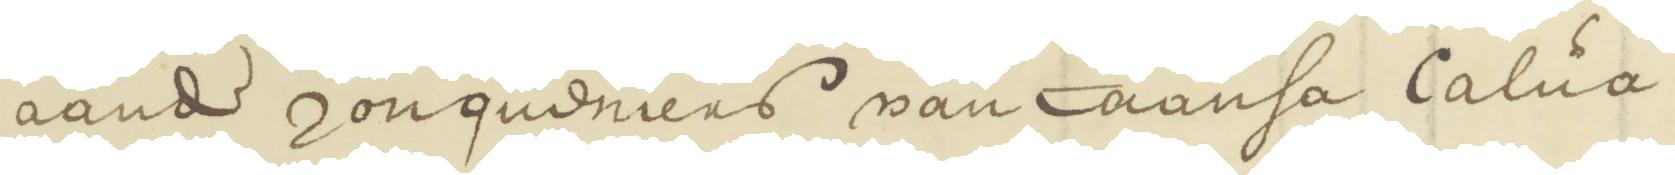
aande Jonqueniers van caansa Calua
